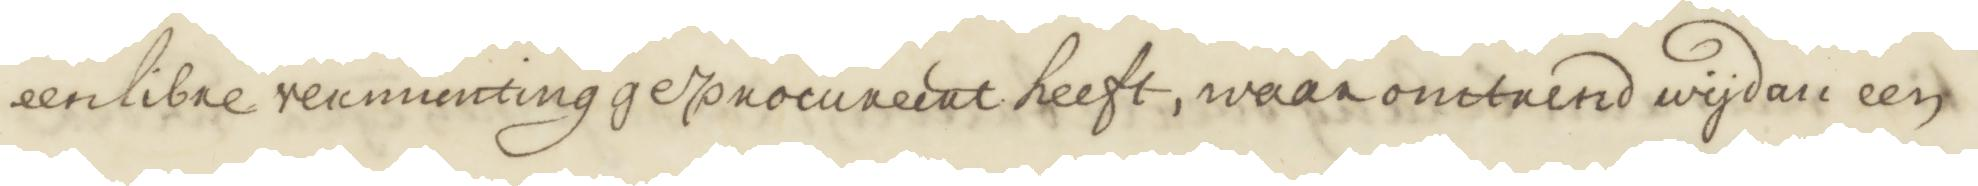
een libre vermunting geprocureert heeft, waar omtrend wij dan een
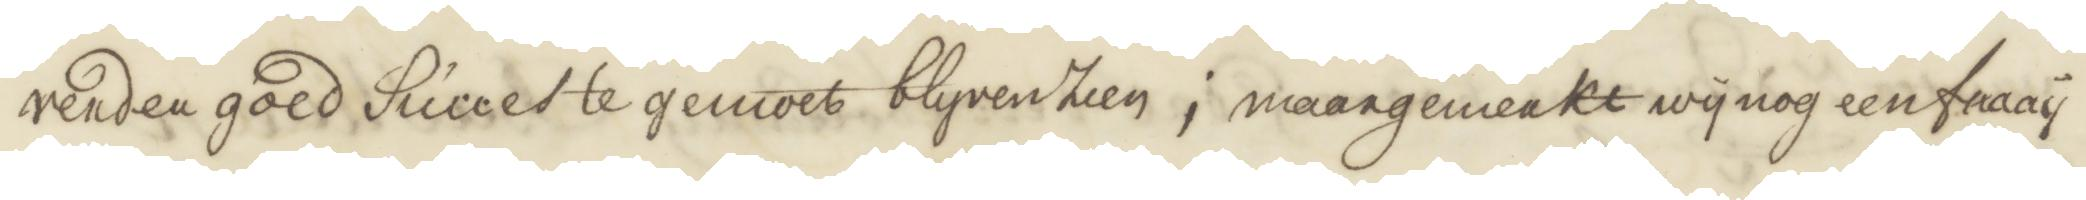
verder goed succes te gemoet blyven zien; maar gemerkt wij nog een fraaij
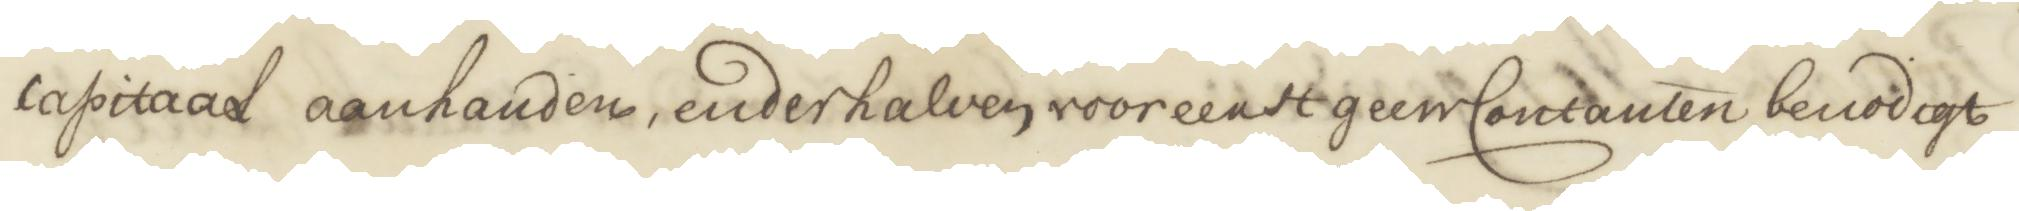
capitaal aanhanden, en derhalven voor eerst geen Contanten benodigt
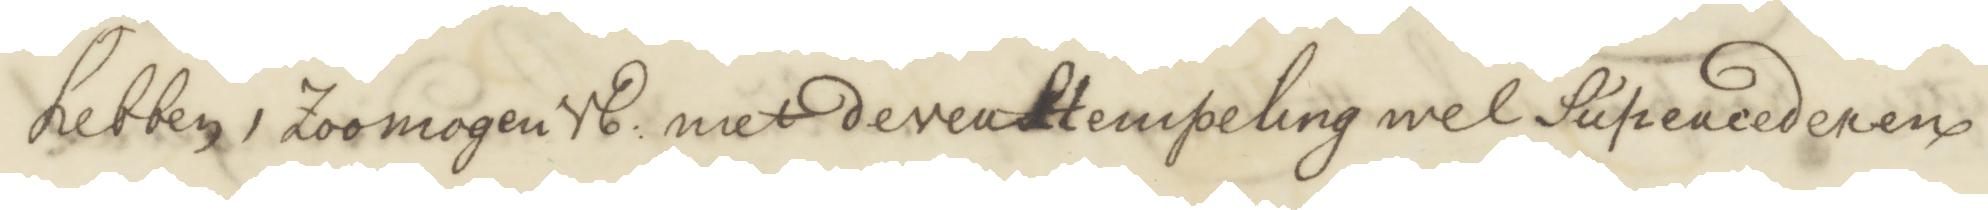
hebben, zoo mogen VE: met de verstempeling wel supercederen
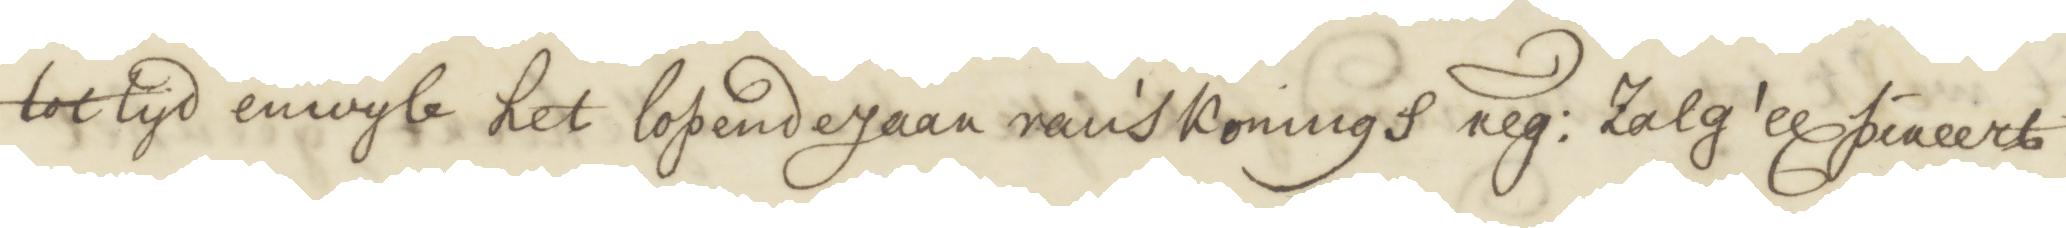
tot tijd en wijle het lopende jaar van 's konings reg: zal g'expireert
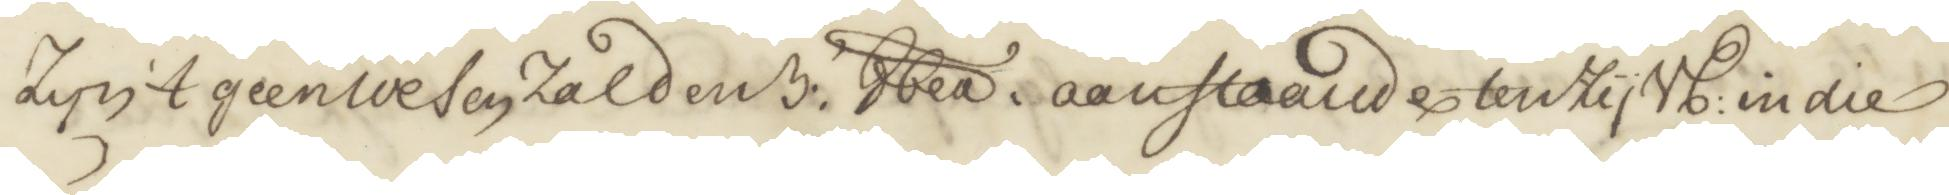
zyn ’t geen wesen zal den 3:' 8ber aanstaande tenzij VE: in die
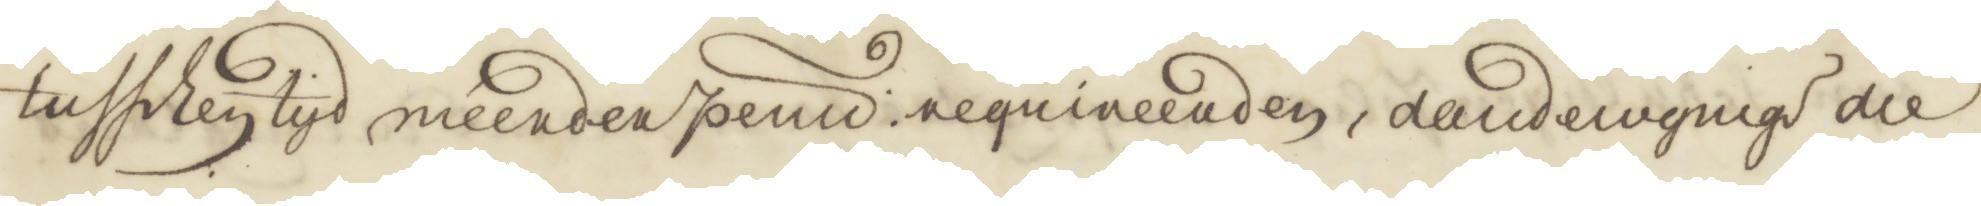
tusschen tijd meerder penn: requireerden, dandewijnige die
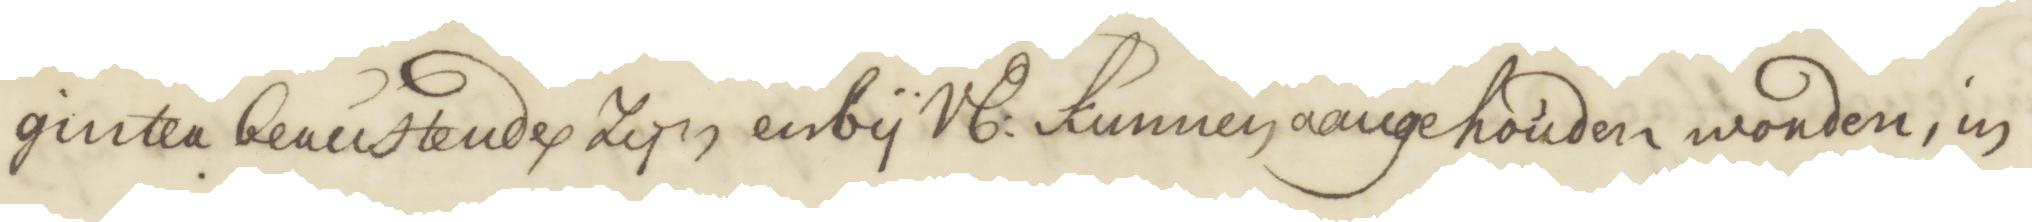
ginter berustende zyn en bij VE: kunnen aangehouden worden, in
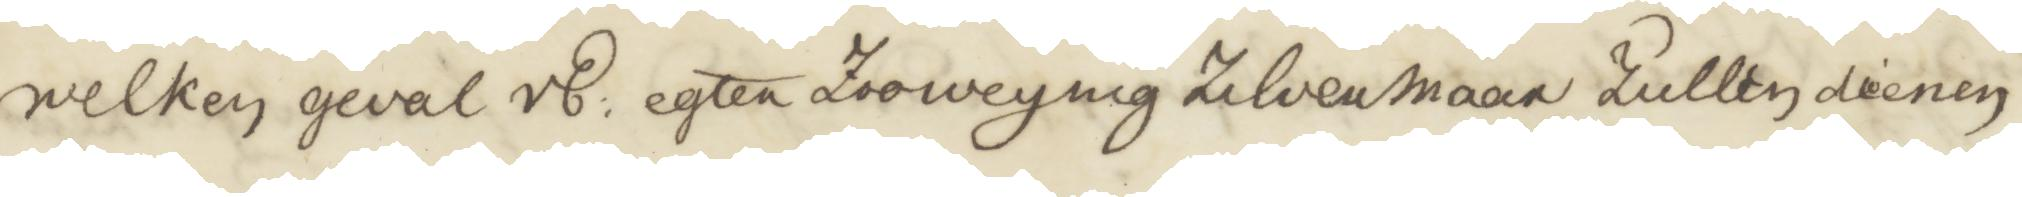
welken geval vE: egter zoo weynig zilver maar zullen dienen
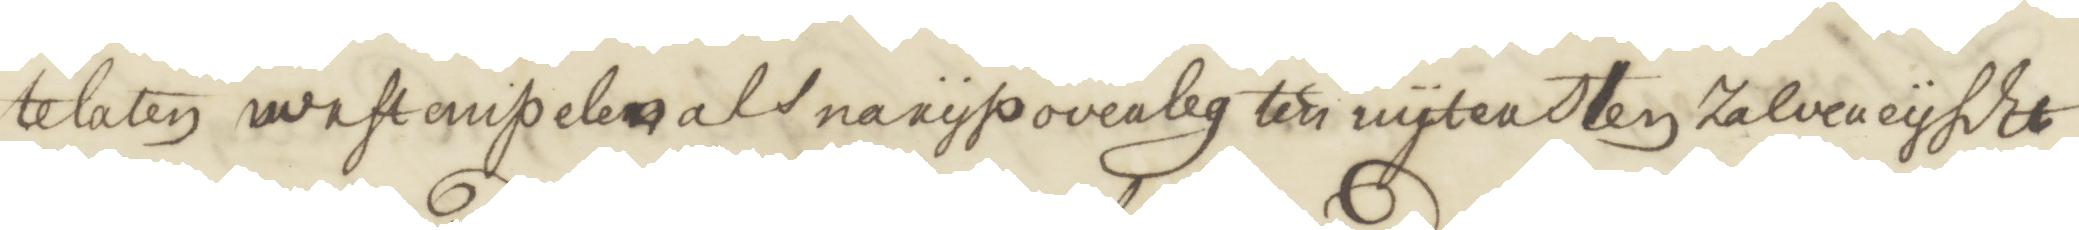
te laten verstempelen als na rijp overleg ten uijtersten zalver eijscht
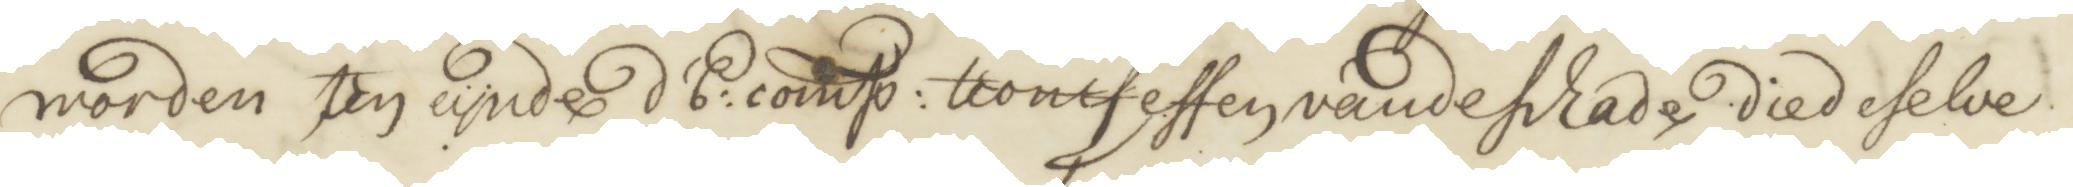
worden ten eijnde d’ E: comp: teontheffen van de schade died eselve
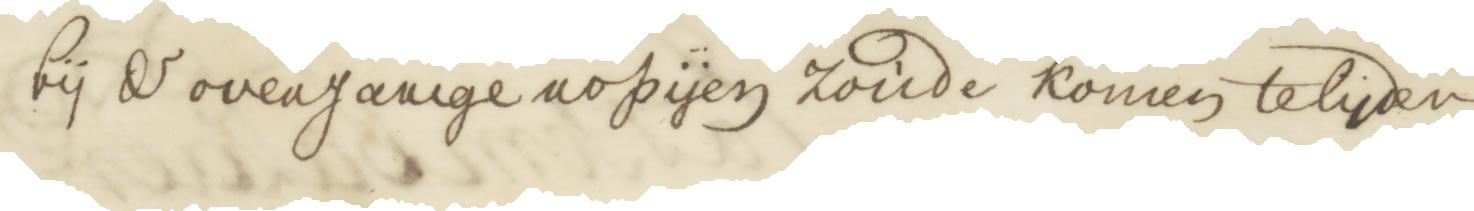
bij de overjarige ropijen zoude komen te lijden
